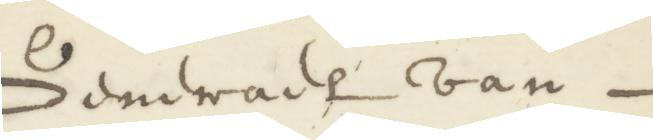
Generael van —
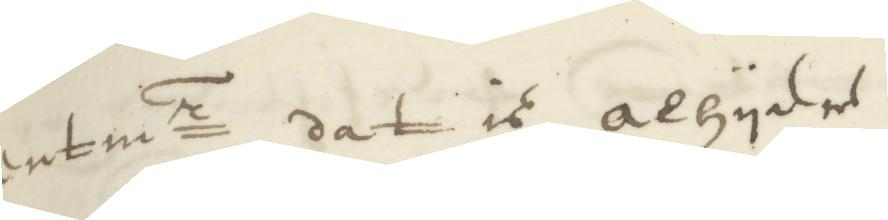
Licentm=r dat is alhijer
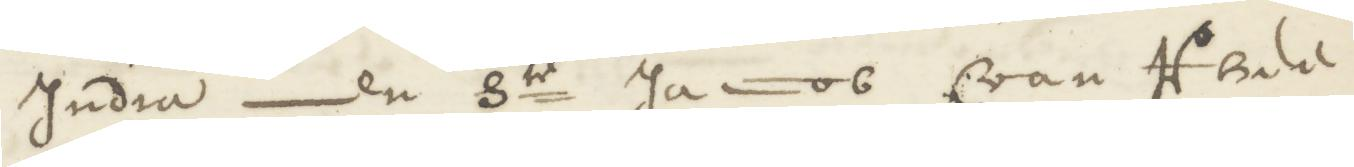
Jndia en h=r Jacob van Rhee
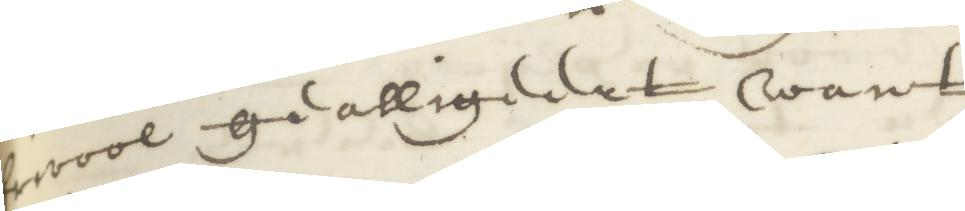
frivool gealligeert want
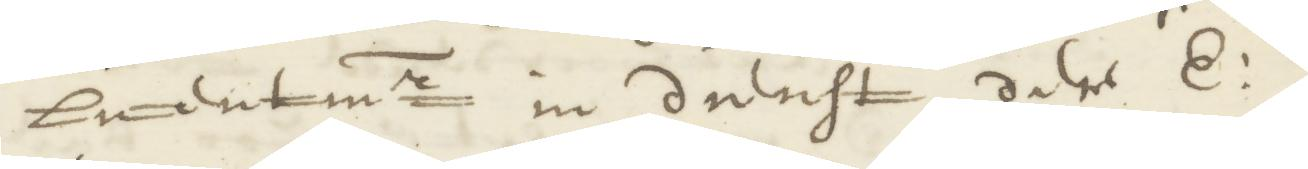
Licentm=r in dienst der E:
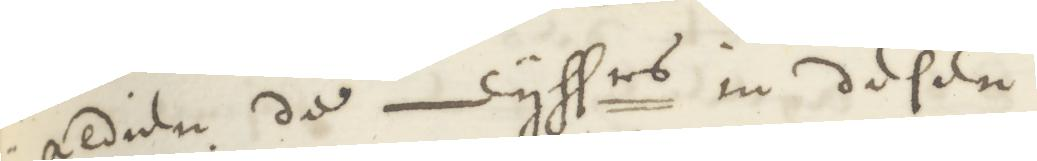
bij aldien de Eijss=r in desen
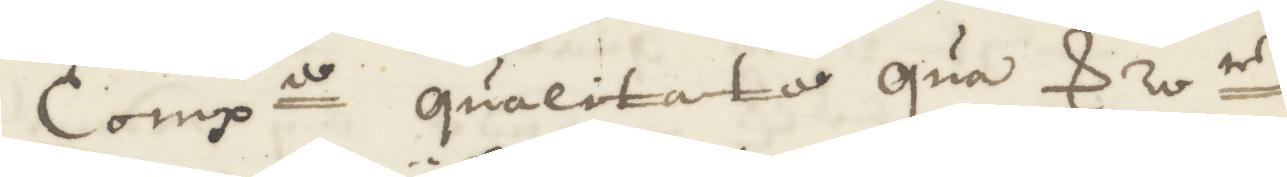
Comp=e qualitate qua verw=rs
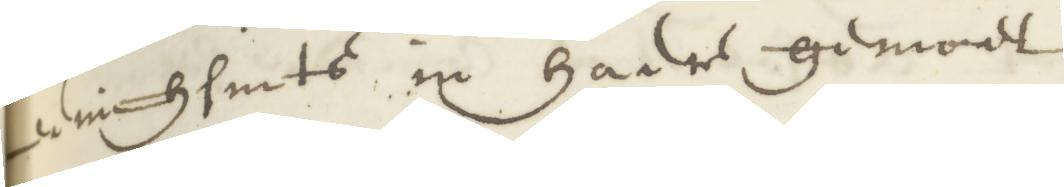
enichsints in haer gemoet
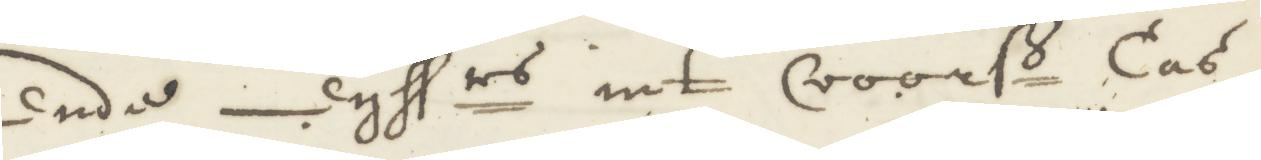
ende eijff=rs in't voorsz Cas
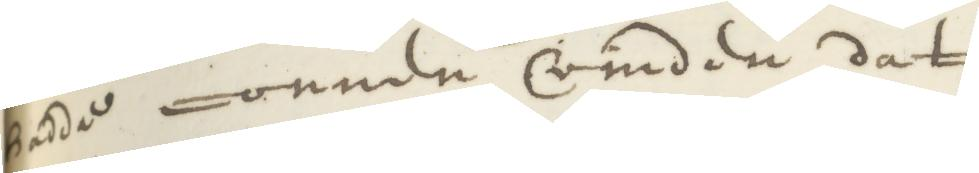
hadde connen vinden dat
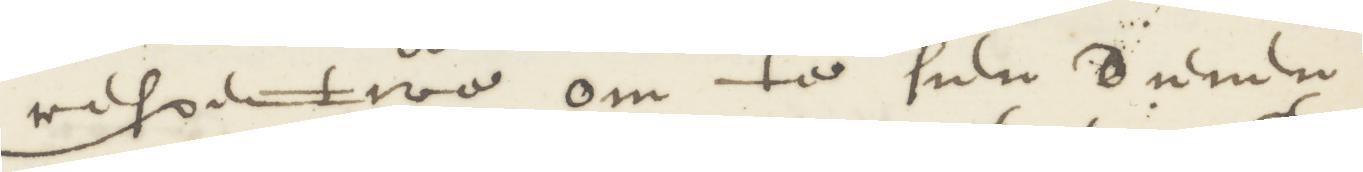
respective om te sien dienen
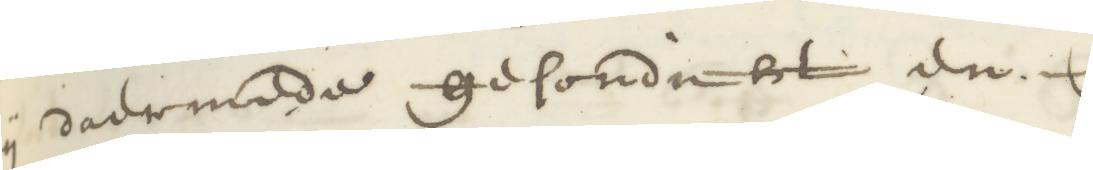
zij daermede gesondicht en.—
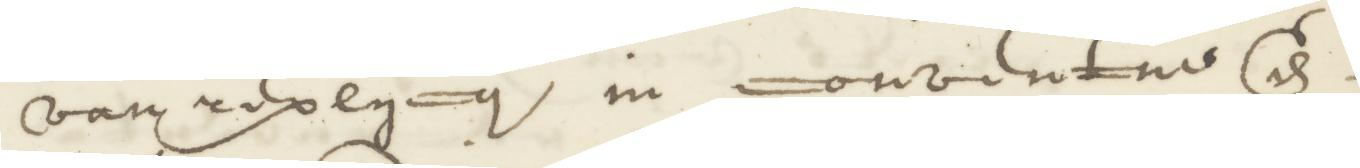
van replijcq, in conventie ende
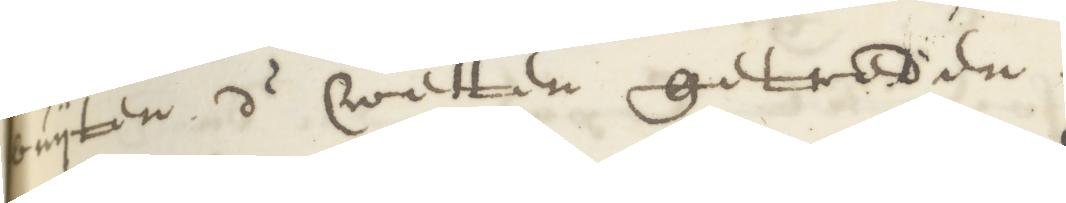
buijten d’ wetten getreden
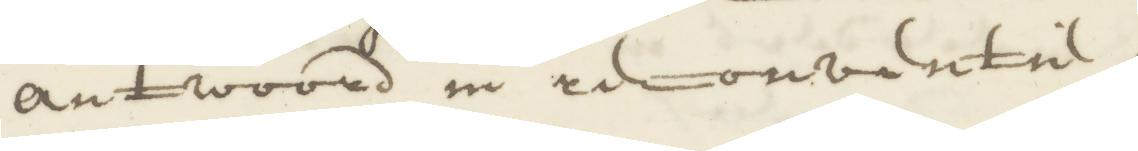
antwoord in reconventie
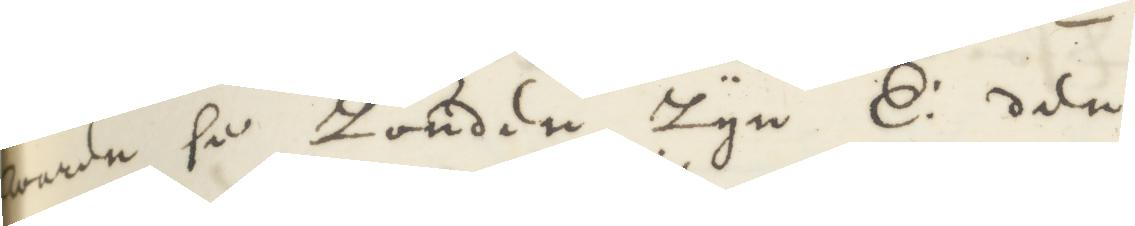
waren se zouden zijn E: den
